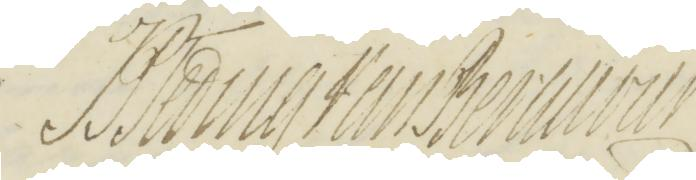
JP Teding van Berkhout
